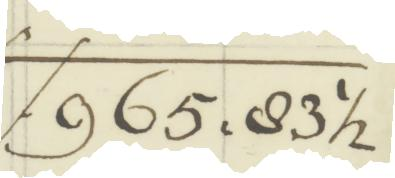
ƒ 965 „ 83½
